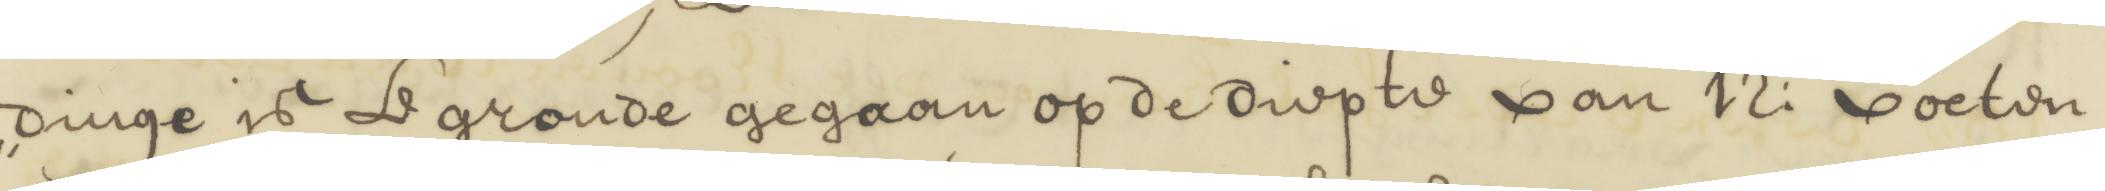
„dinge is te gronde gegaan op de diepte van 12: voeten
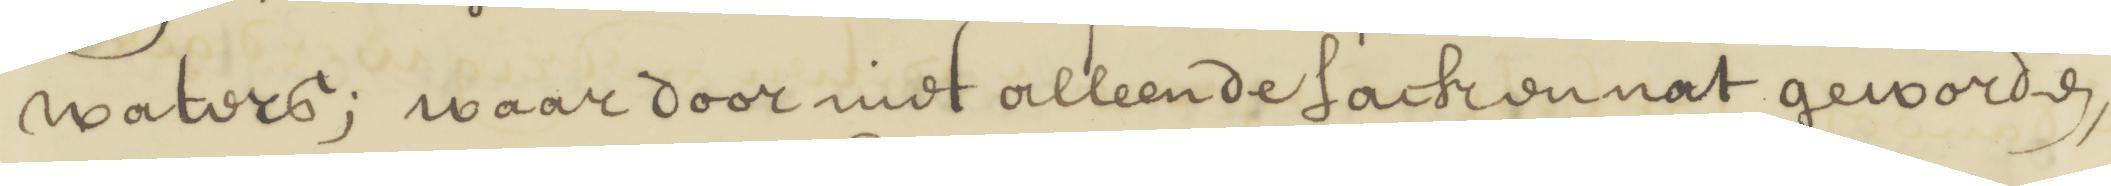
waters; waar door niet alleen de sacken nat geworden,
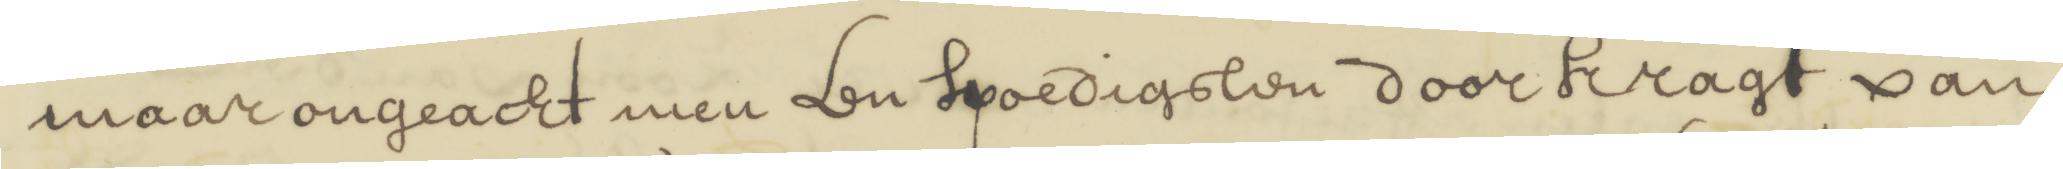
maar ongeacht men ten spoedigsten door kragt van
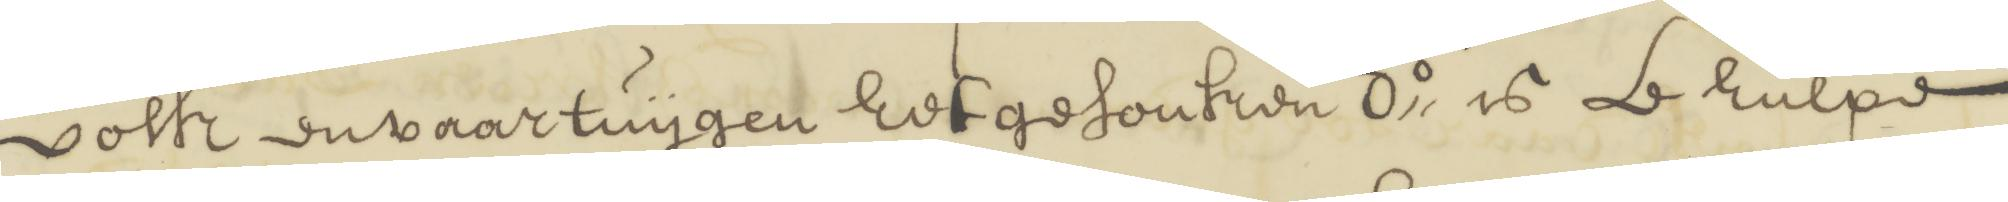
volk en vaartuijgen het gesonken d„o is te hulpe
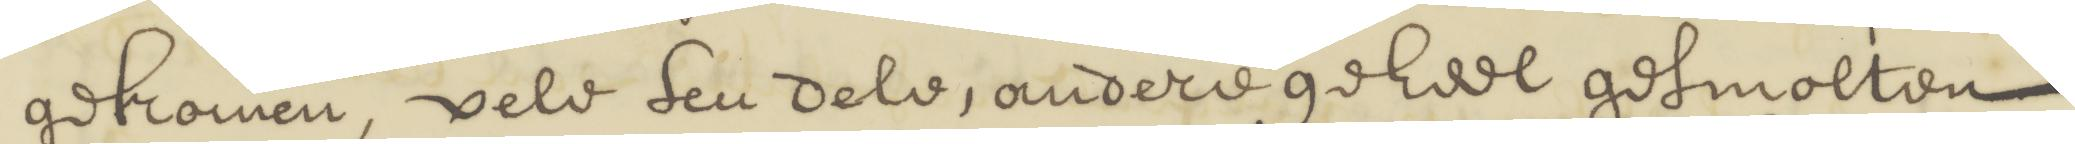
gekomen, vele ten dele, andere geheel gesmolten
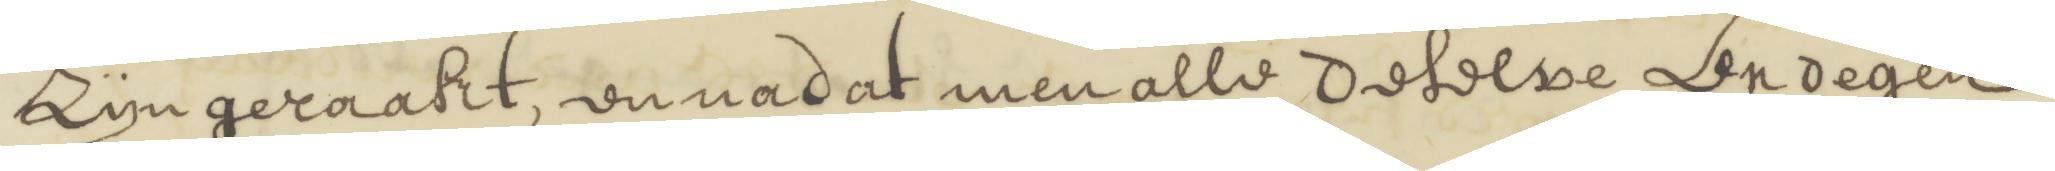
zijn geraakt, en nadat men alle deselve ter degen
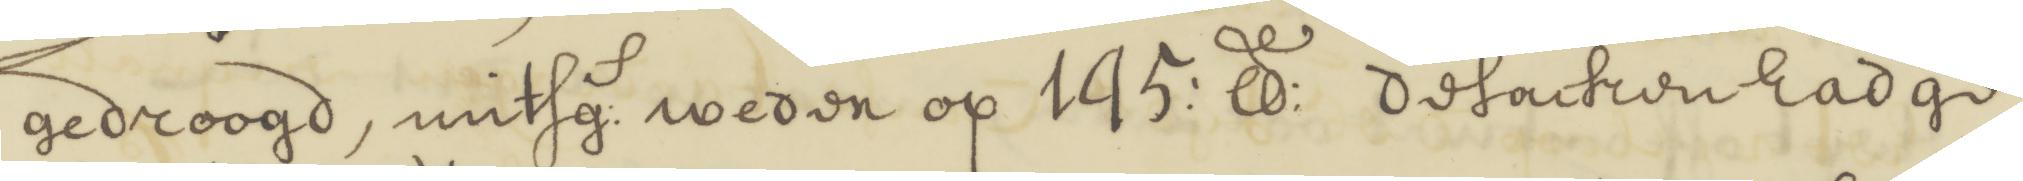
gedroogd, mitsg:s weder op 145: lb: de sacken had ge
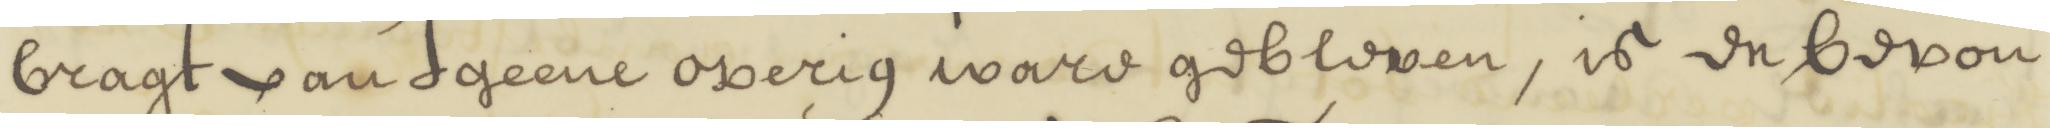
bragt van 't geene overig ware gebleven, is er bevon
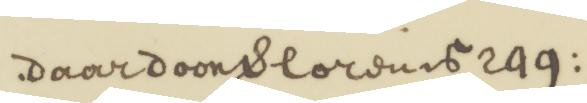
daardoor verloren is 249:
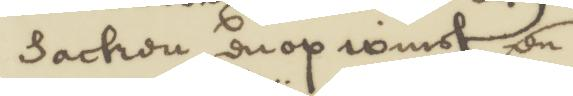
sacken, en op winst en
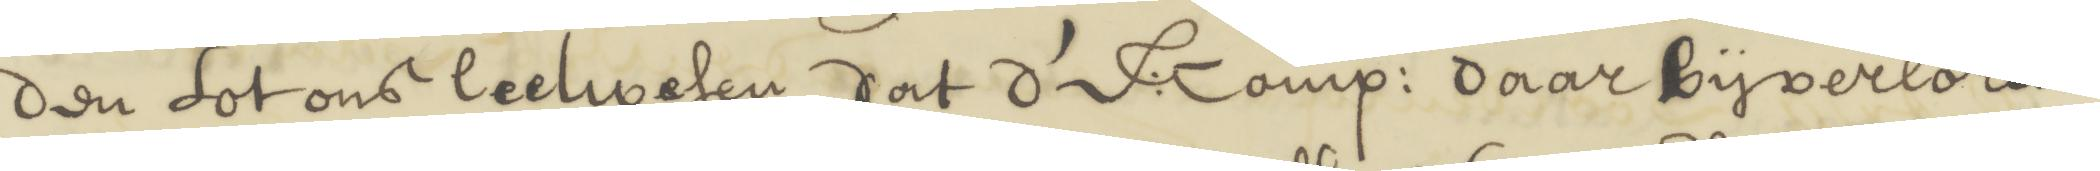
den tot ons leetwesen, dat d’E: Comp: daar bij verloren
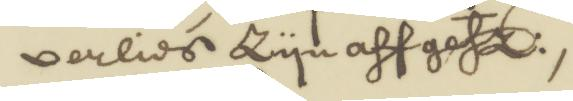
verlies zijn affgesz:,
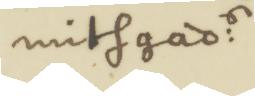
mitsgad:s
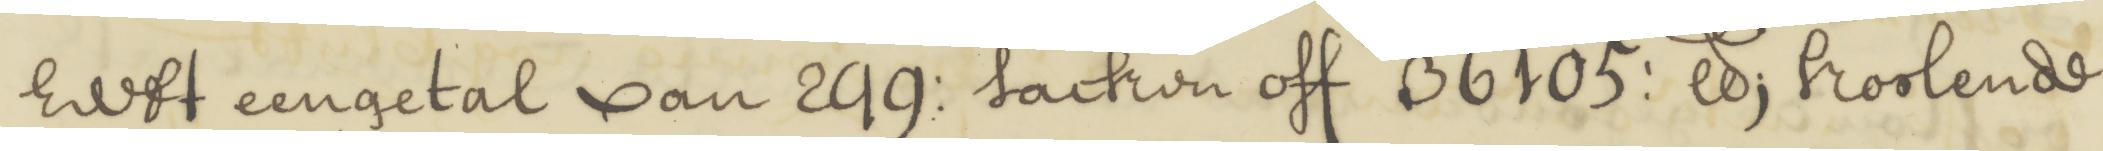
heeft een getal van 249: sacken off 36105: lb; kostende
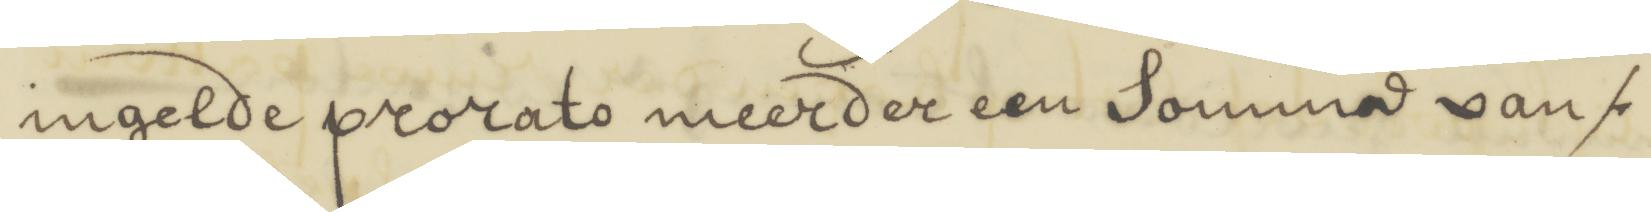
in gelde prorato meerder een somme van /.
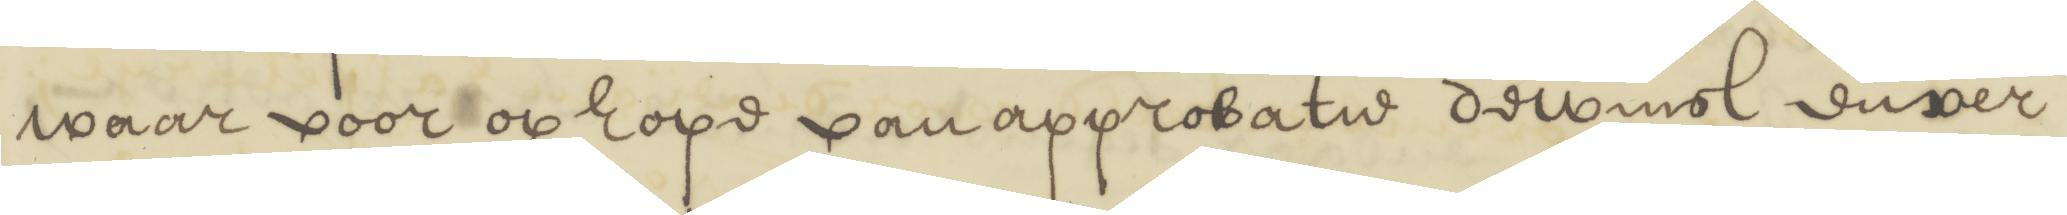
waar voor op hope van approbatie de winst en ver
